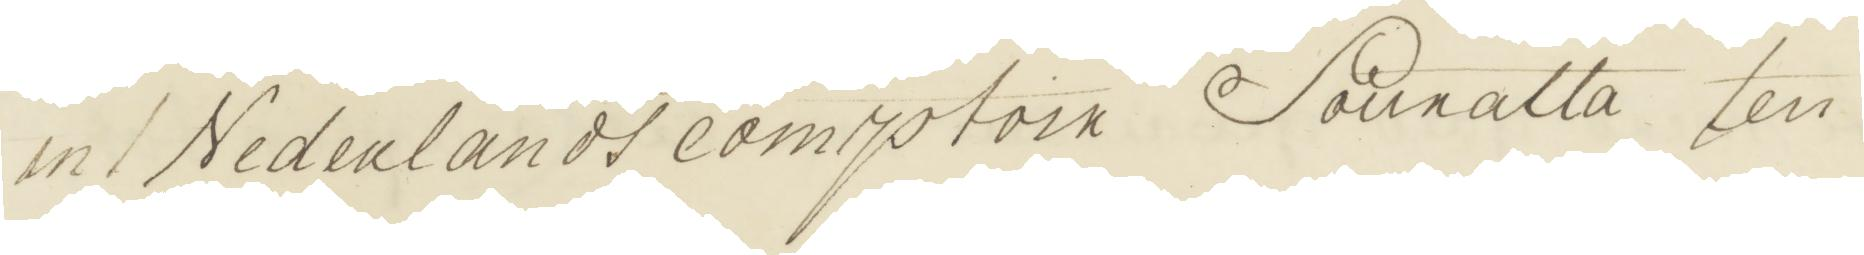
in / Nederlands comptoir Souratta ten
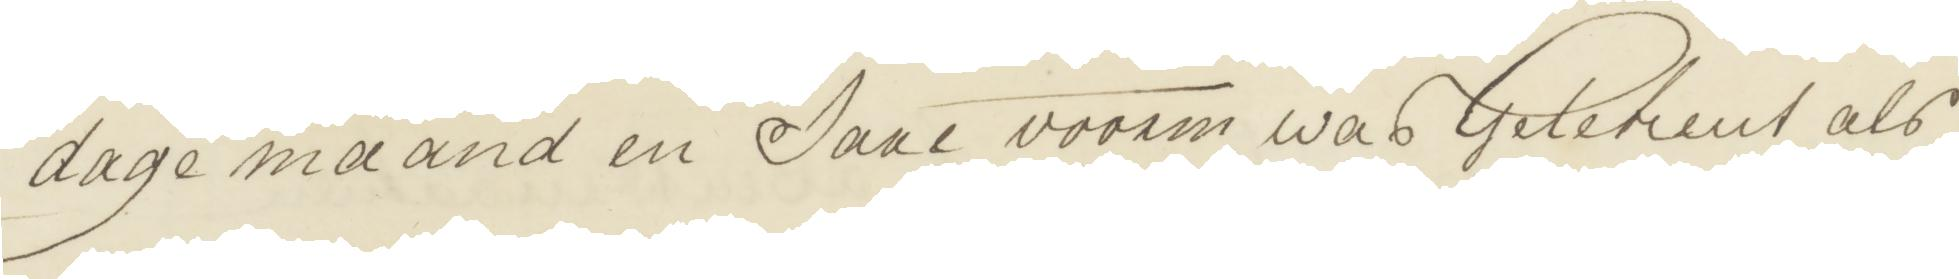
dage maand en Iare voorm was Getekent als
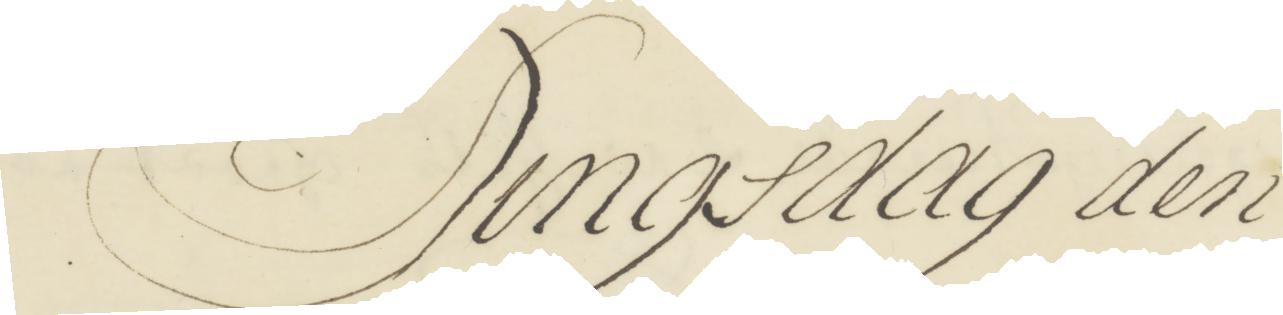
Dingsdag den
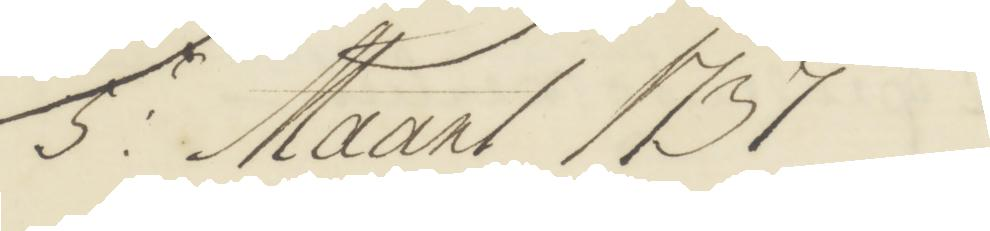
5:' Maart 1737
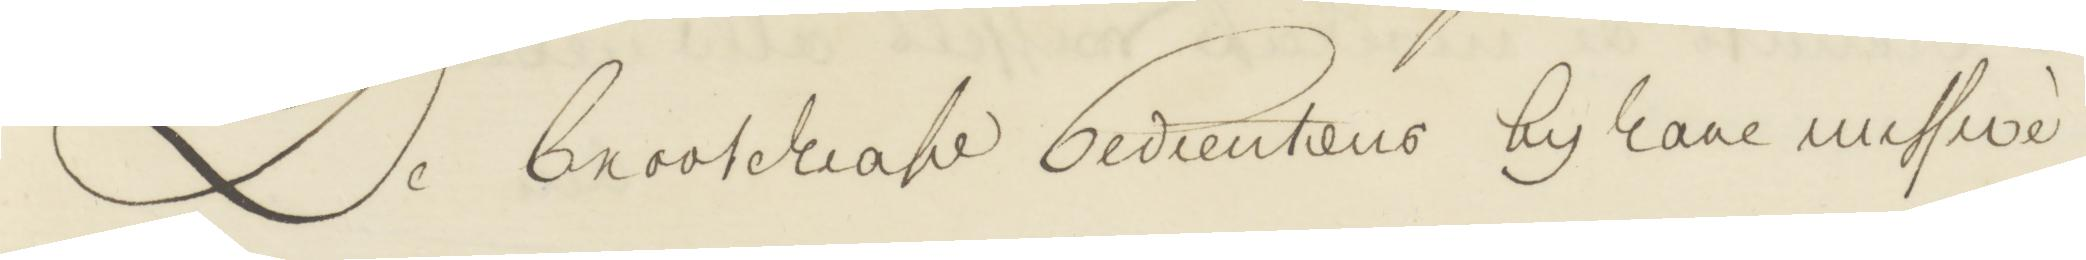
De brootchiase bedientens by hare missive
